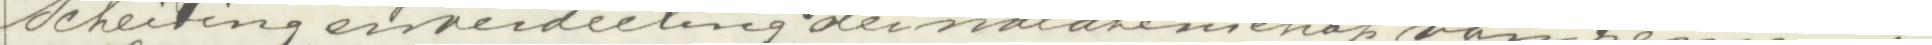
scheiding en verdeeling der nalatenschap van genoemde
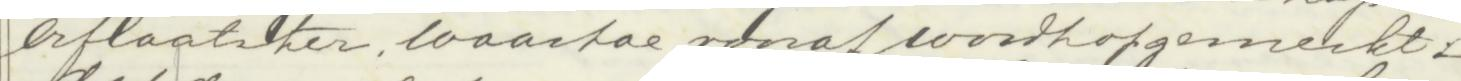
Erflaatster, waartoe vooraf wordt opgemerkt:
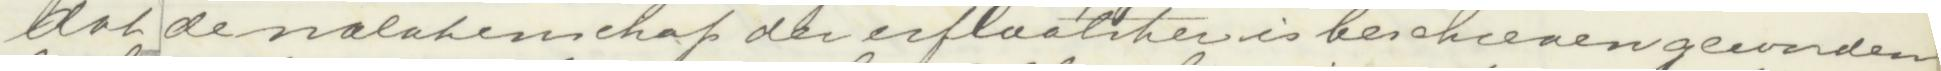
dat de nalatenschap der erflaatster is beschreven geworden
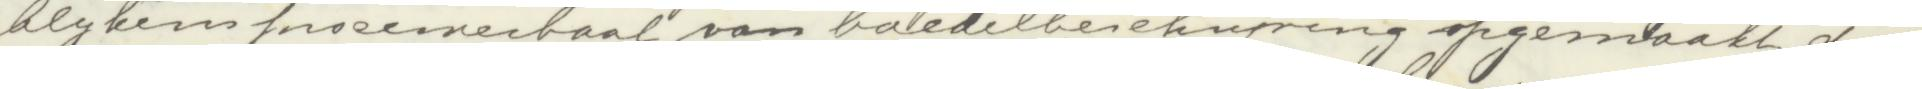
blykens procesverbaal van boedelbeschryving opgemaakt door
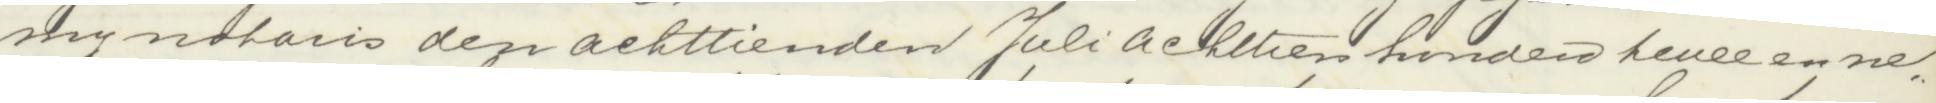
my notaris den achttienden Juli achttien honderd twee en ne„
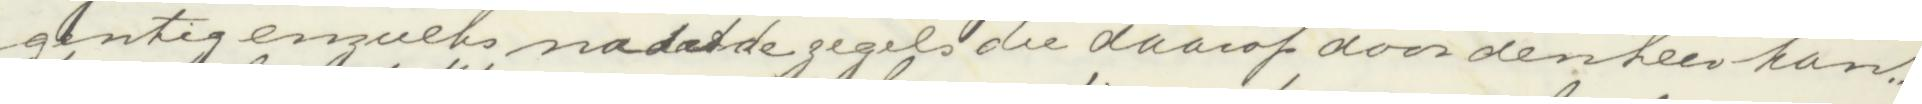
gentig en zulks nadat de zegels die daarop door den heer kan„
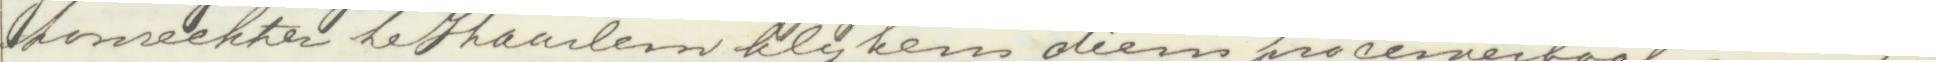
tonrechter te Haarlem blykens diens procesverbaal van den
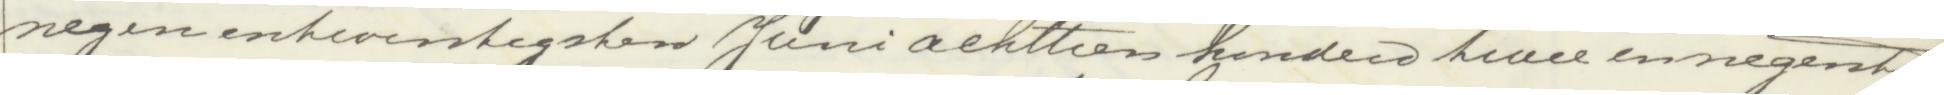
negen entwintigsten Juni achttien honderd twee en negentig
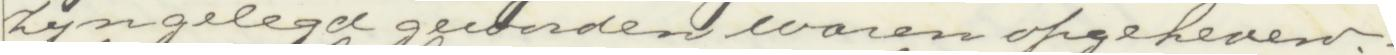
zyn gelegd geworden waren opgeheven.
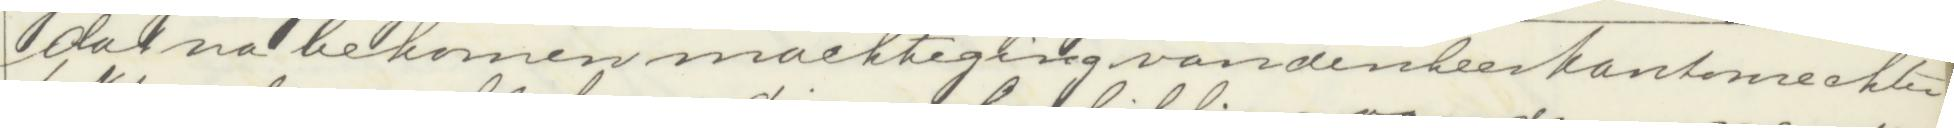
dat na bekomen machtiging van den heer kantonrechter
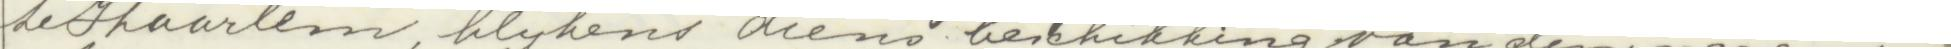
te Haarlem, blykens diens beschikking van den negenden
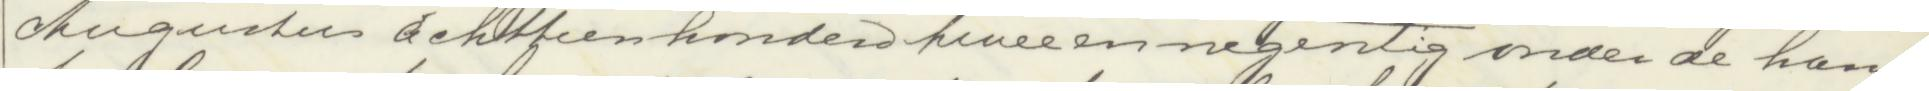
Augustus achttien honderd twee en negentig onder de hand
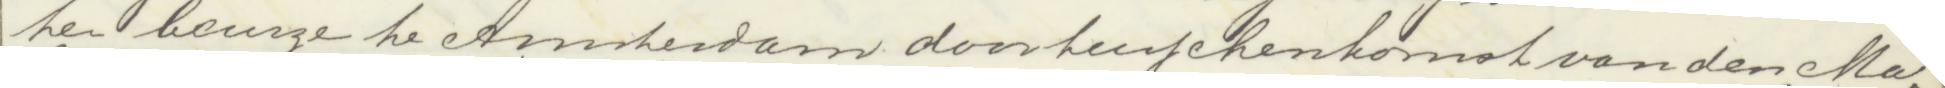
ten beurze te Amsterdam door tusschenkomst van den Ma
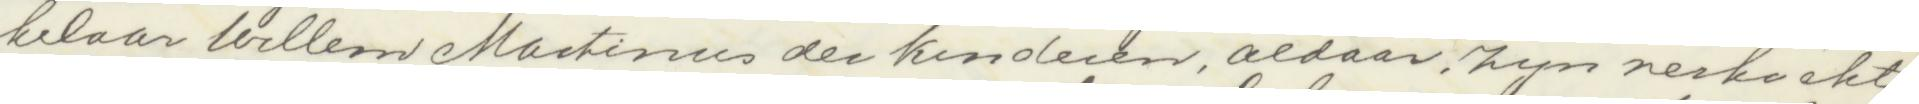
kelaar Willem Martinus der kinderen, aldaar, zyn verkocht
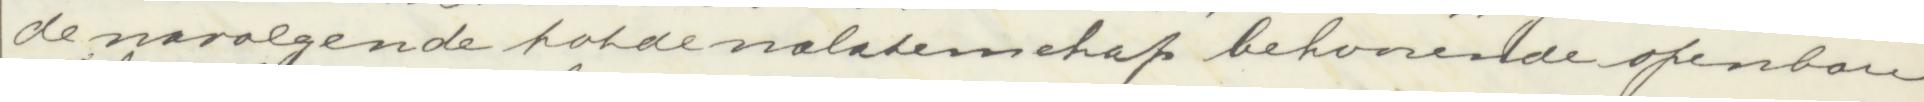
de navolgende tot de nalatenschap behoorende openbare
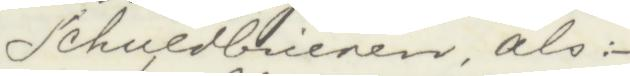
Schuldbrieven, als:
